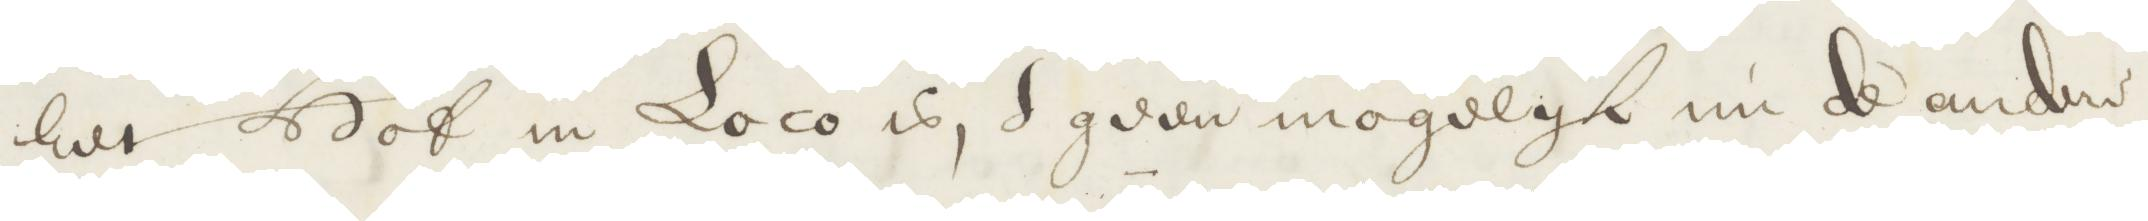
het Hof in Loco is, 't geen mogelijk nu de andere
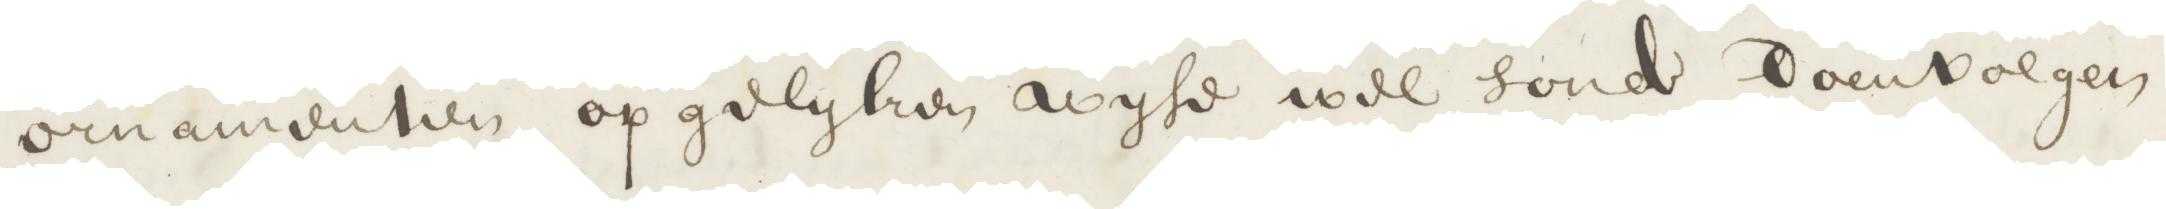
ornamenten op gelijken wijse wel soude doen volgen
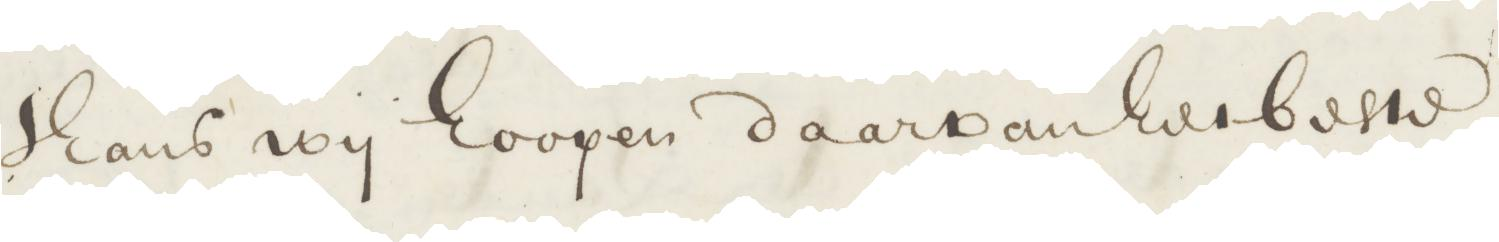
thans wij hoopen daarvan het beste
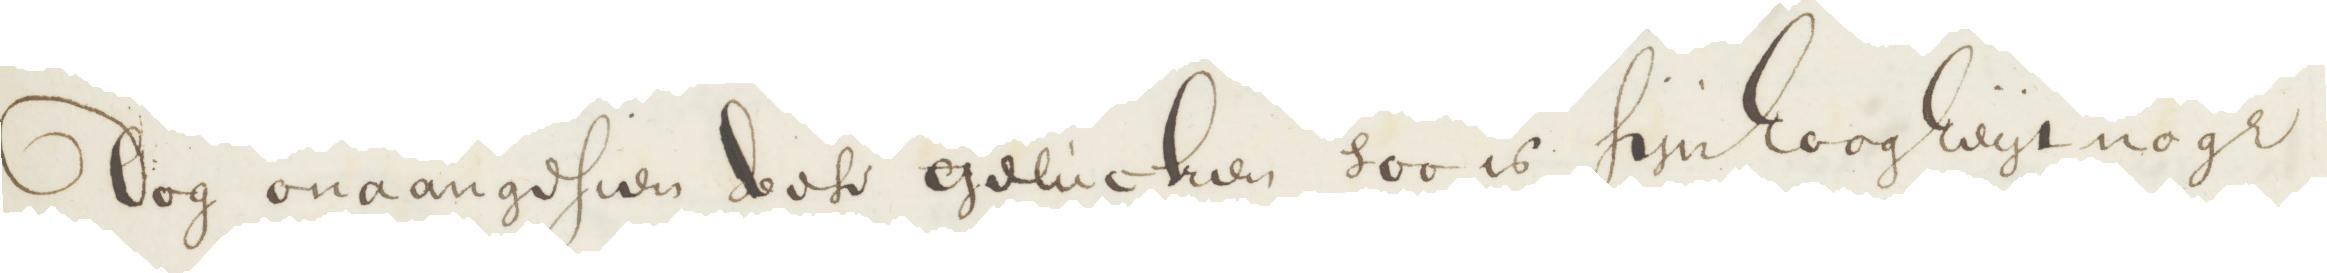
Dog onaangesien deese gelucken soo is sijn hoogheijt nogh
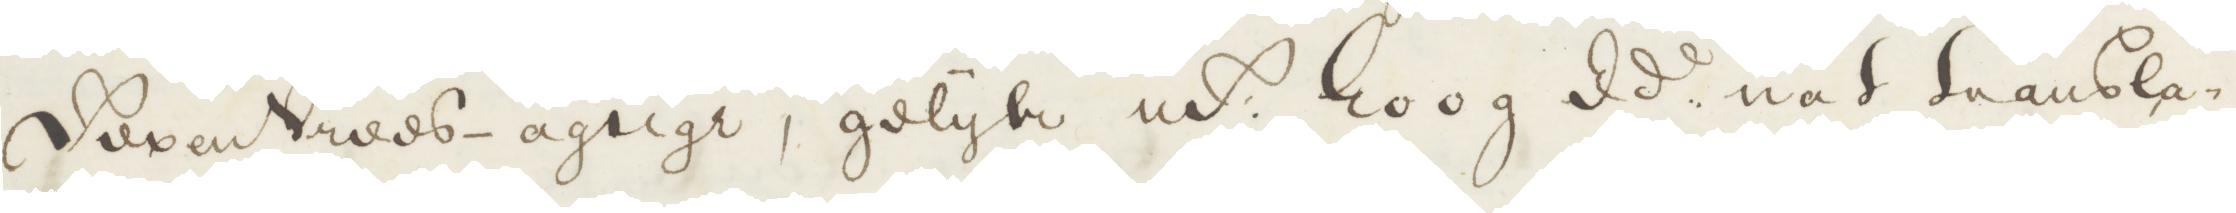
Eeven Vrees-agtigh, gelijk uE: hoog Ed:e na 't transla„
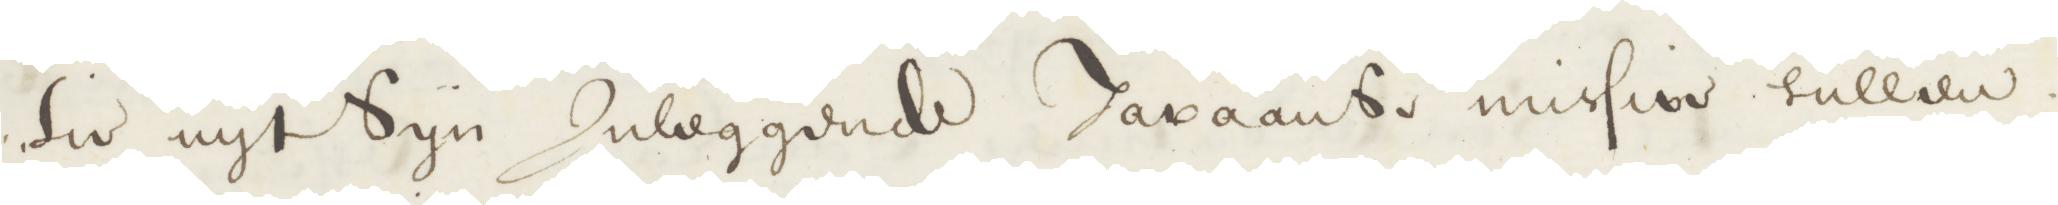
„tie uijt Sijn Jnleggende Javaanse missive sullen
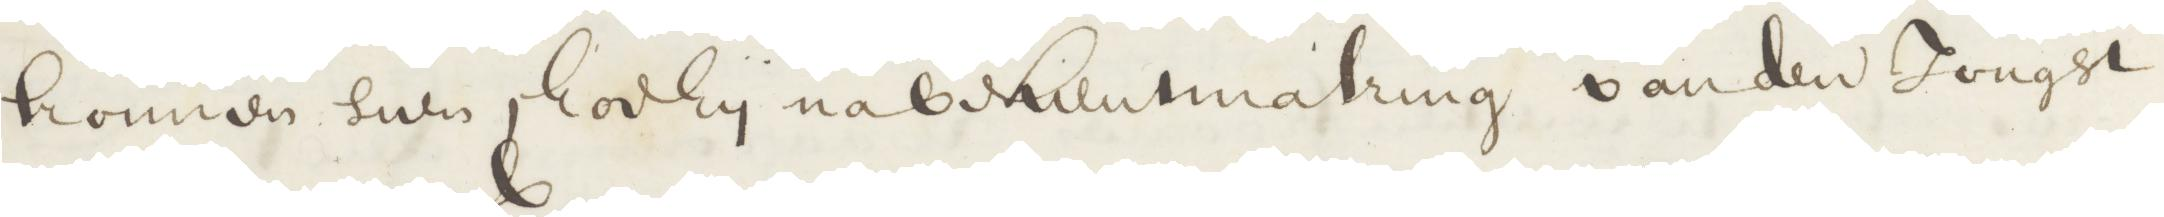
konnen sien, hoe hij na bekentmaking van den Iongst
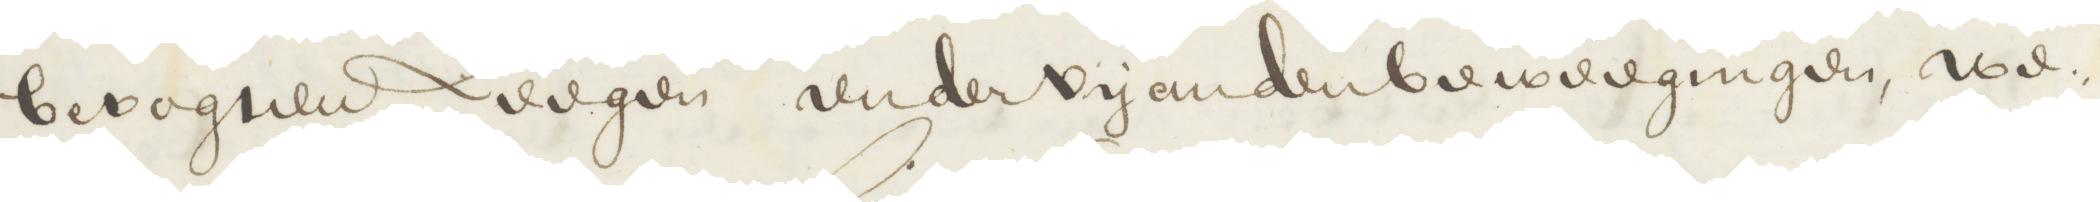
bevogten Zeegen en der vijanden beweegingen, we„
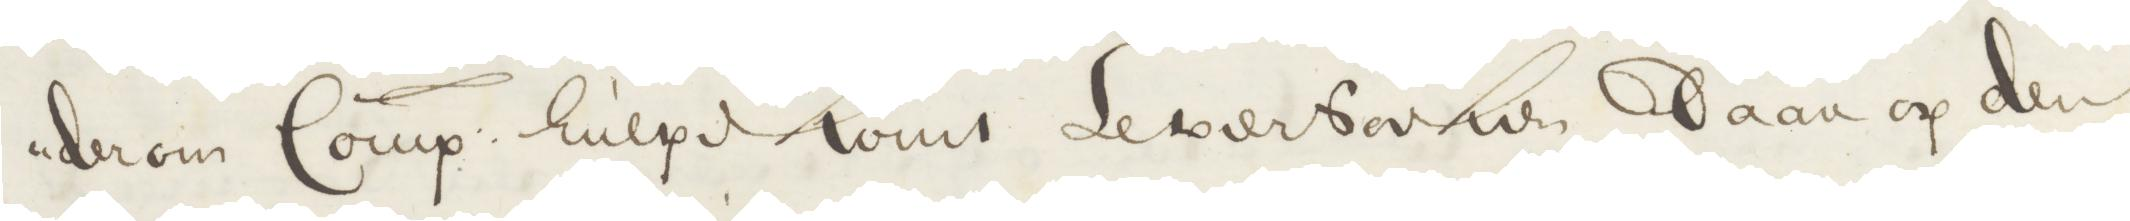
„der om Comp: hulpe komt te versoeken daar op den
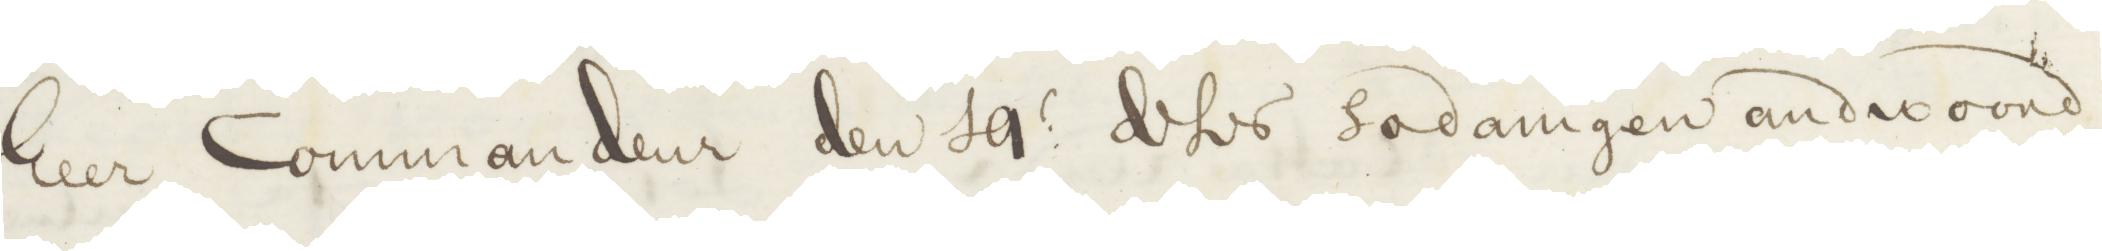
heer Commandeur den 19:' deses sodanigen andwoord
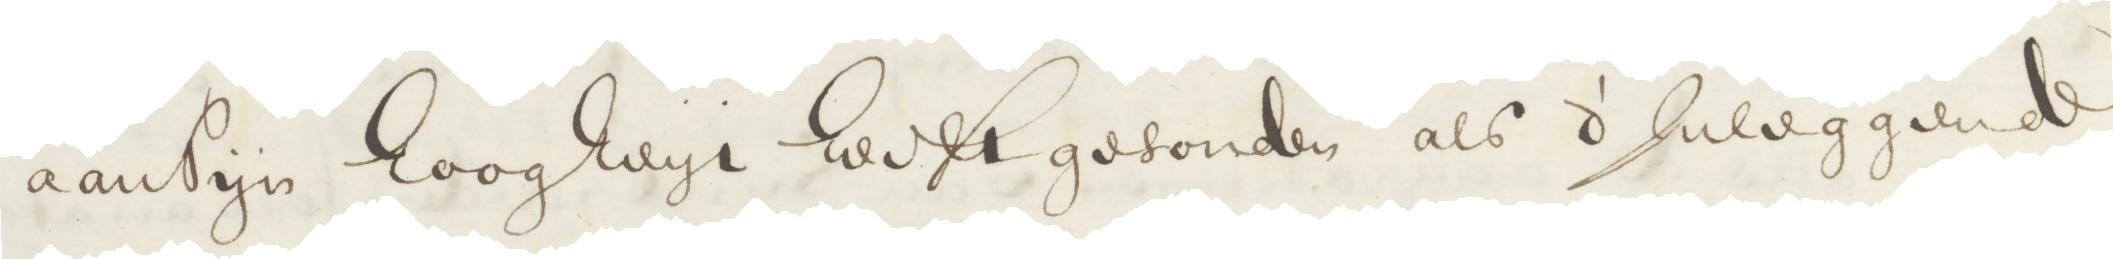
aan Sijn hoogheijt heeft gesonden als d' Jnleggende
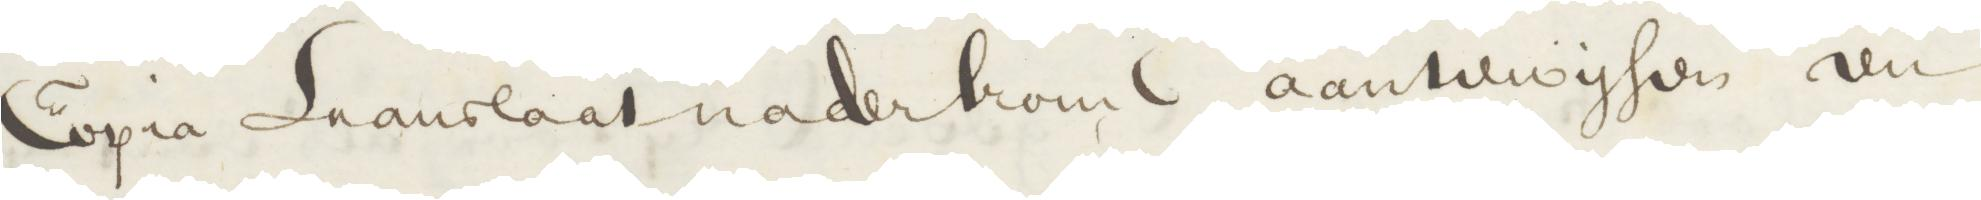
Copia Translaat nader komt aan tewijsen en
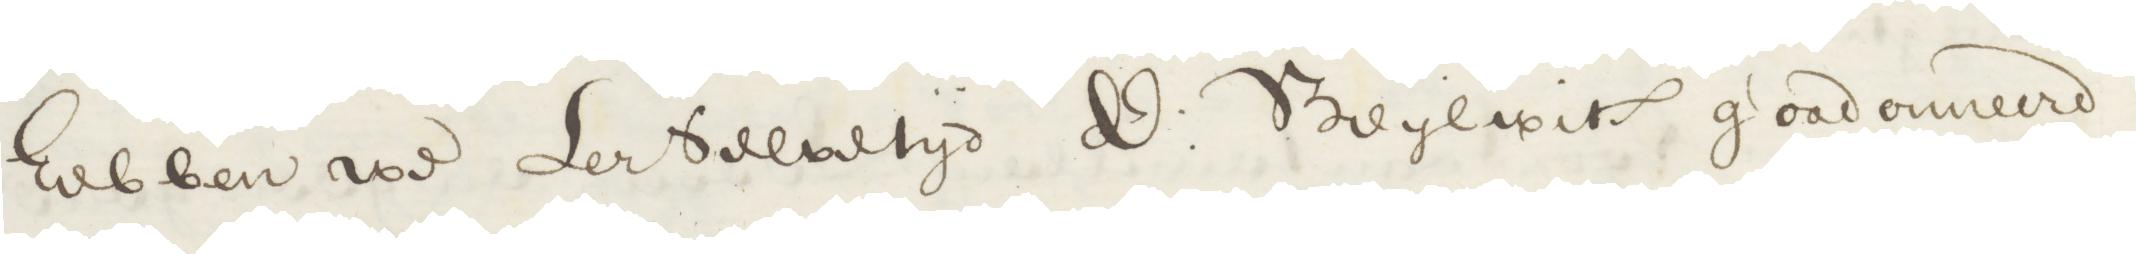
hebben we ter selvetijd dE: Beijlwits g’ordonneerd
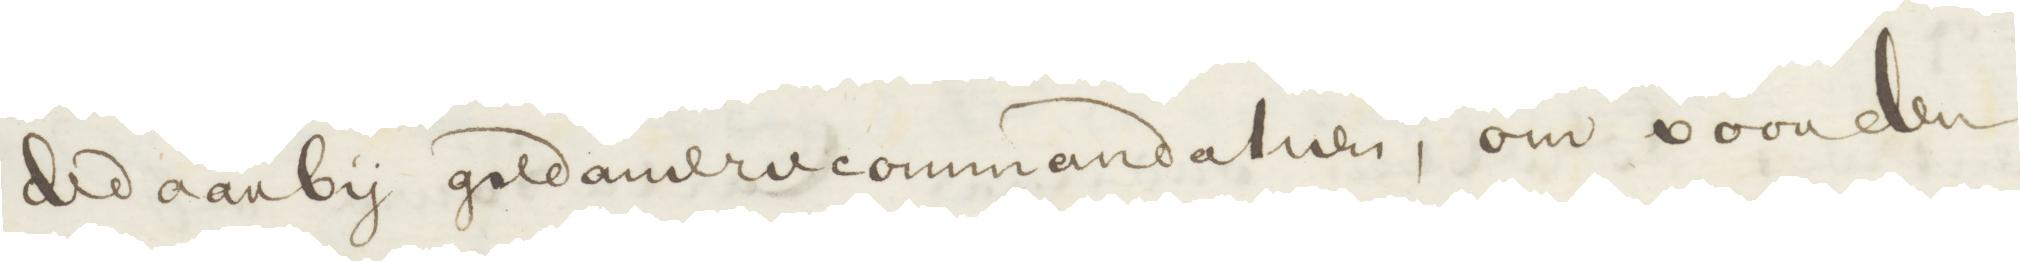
de daarbij gedane recommandatien, om voor den
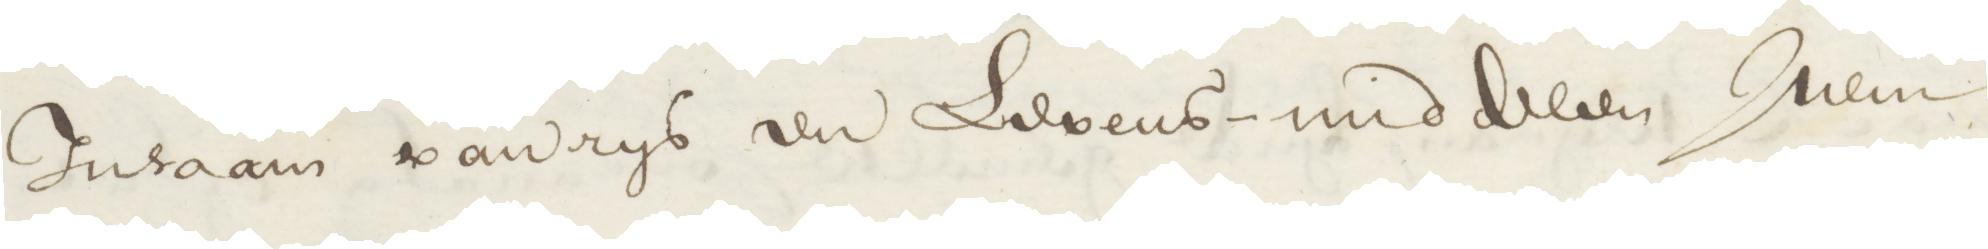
Insaam van rijs en Levens-middelen Item
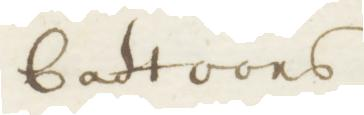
bastoors
